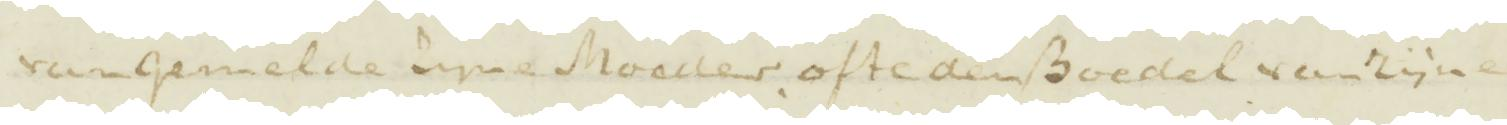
van gemelde zyne Moeder, of te den Boedel van zijne
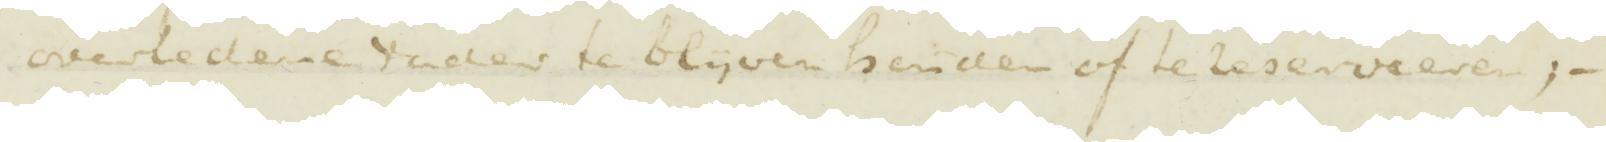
overledene vader te blijven houden of te reserveeren; –
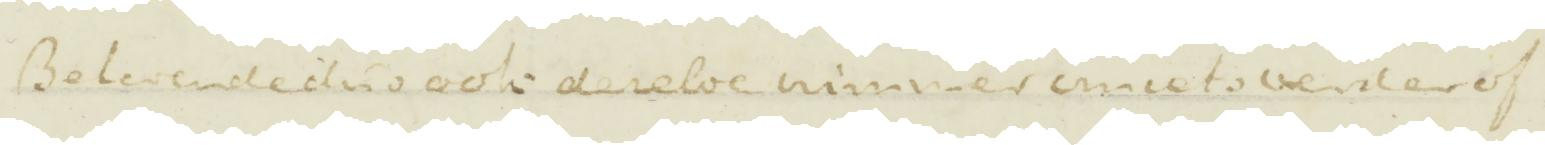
Belerende dus ook dezelve nimmer om iets verder of
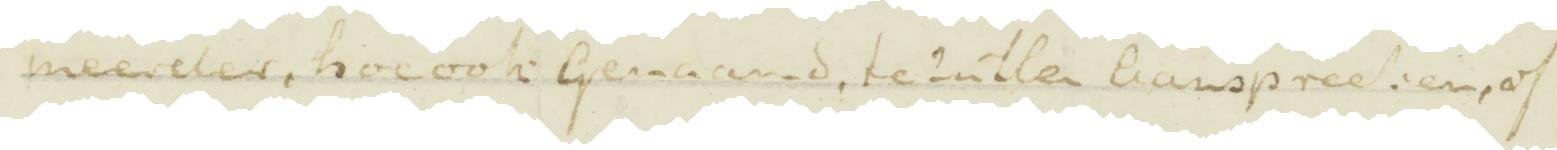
meerder, hoe ook Genaamd, te zullen Aanspreeken, of
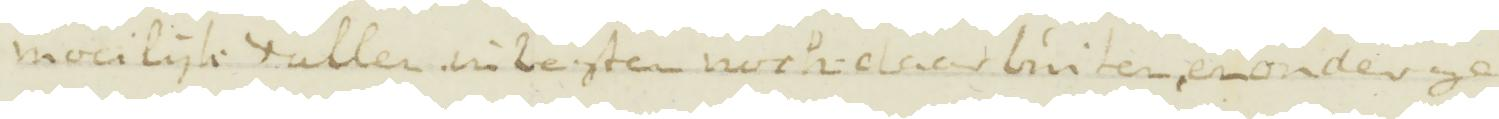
moeilijk zullen in regten noch daar buiten, en zonder ge
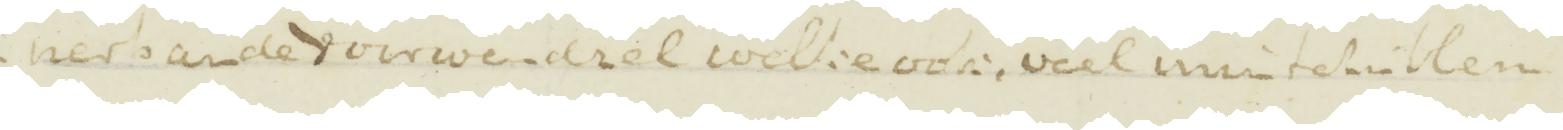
nerhande voorwendzel welke ook, veel min te zullen
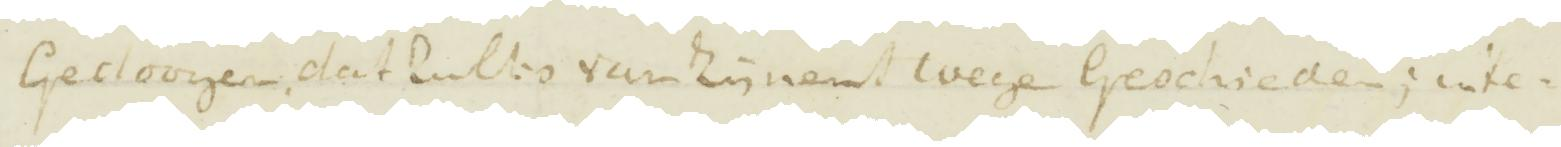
Gedoogen, dat zulks van zijnent toege Geschieden; inte=
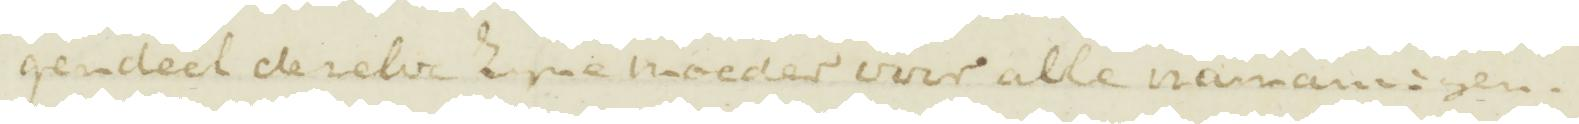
gendeel de zelve zyne moeder voor alle namaningen -
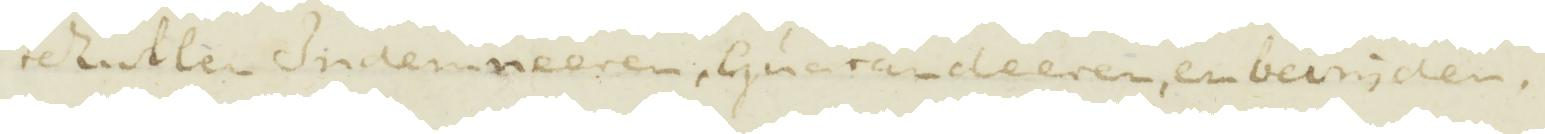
te zullen Jndemneeren, Guarandeeren, en bevrijden,
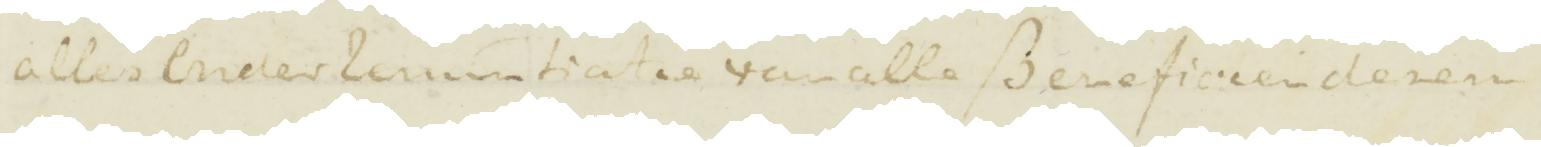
alles onder remuntiatie van alle Beneficien dezen
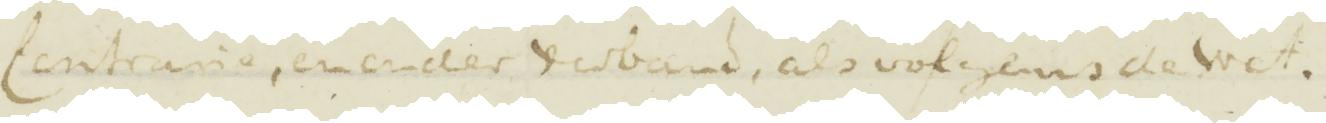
Contrarie, en onder verband, als volgens de wet.
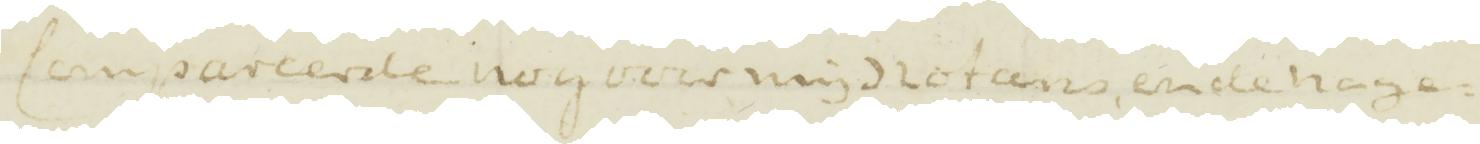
Compareerde nog voor mij Notaris, en de nage-
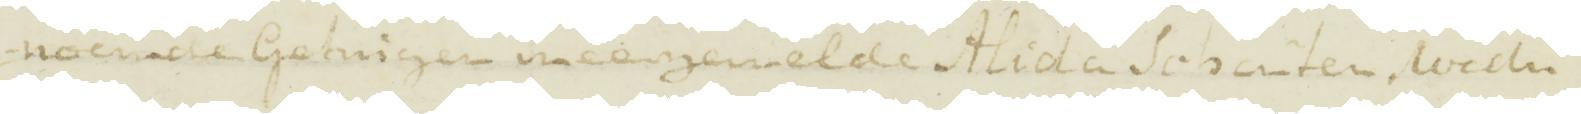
-noemde Getuigen meergemelde Alida Schouten, wedu
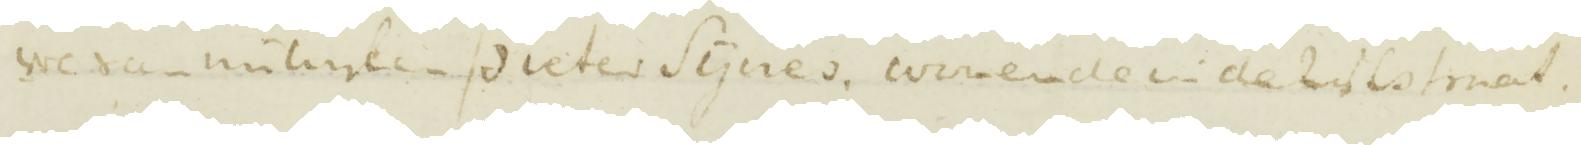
we van nu wijlen Pieter Sijnes, wonende in de zylstraat.
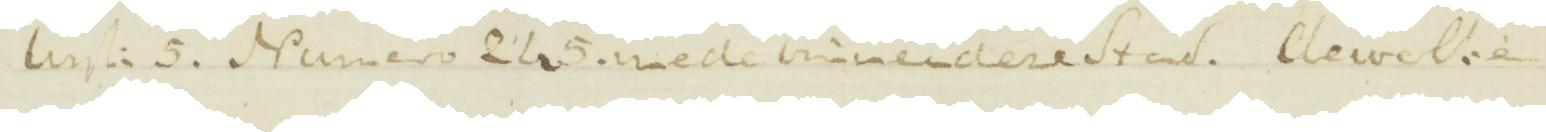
wyk 5. Numero 245. mede binnen deze stad. Dewelke
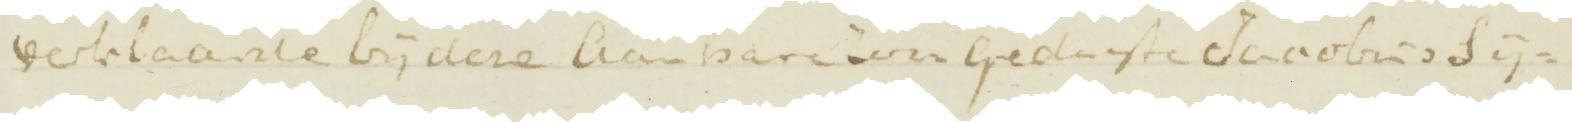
verklaarde bij deze Aan hare zoon Gedagte Jacobus Sij=
